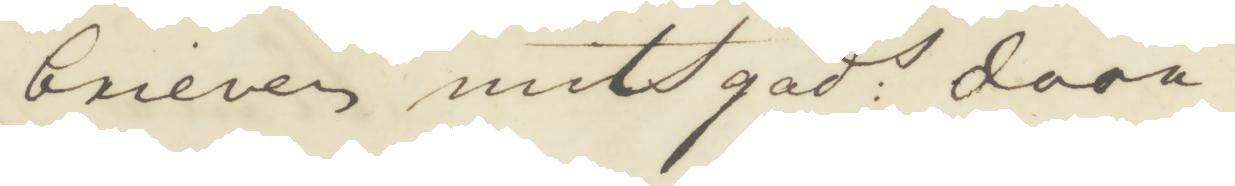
brieven mitsgad:s door
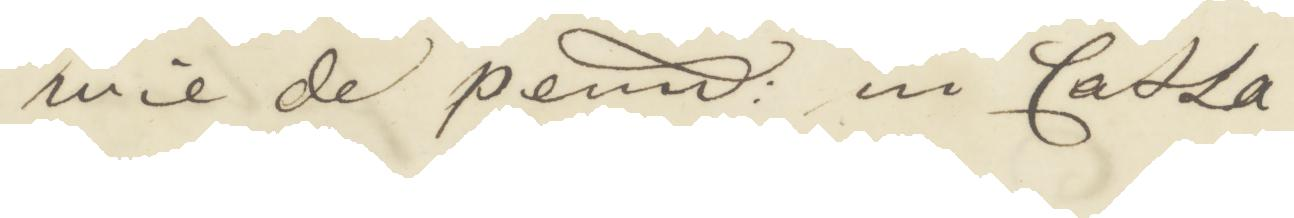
wie de penn: in Cassa
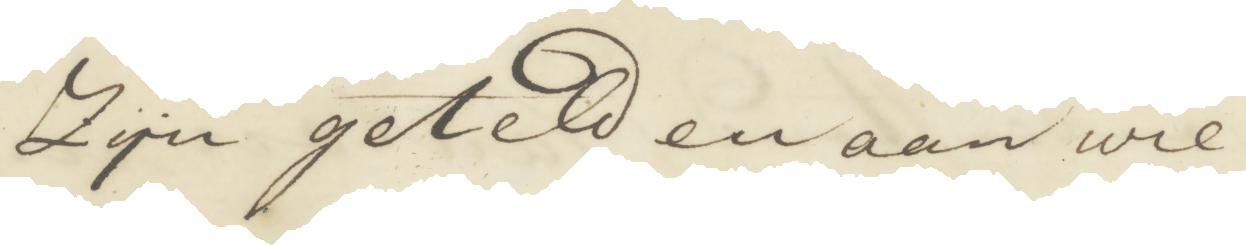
zijn geteld en aan wie
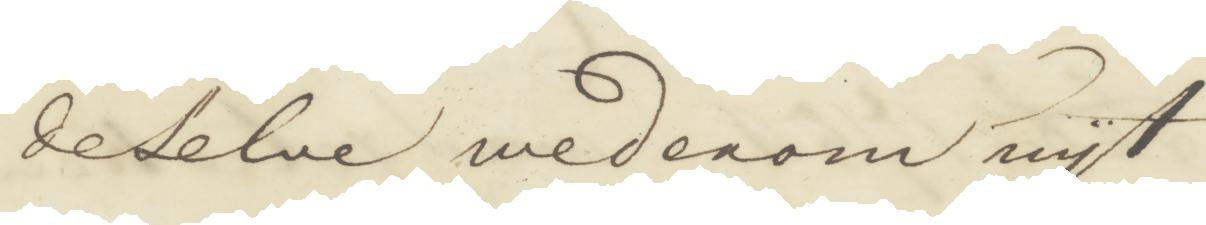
deselve wederom uijt
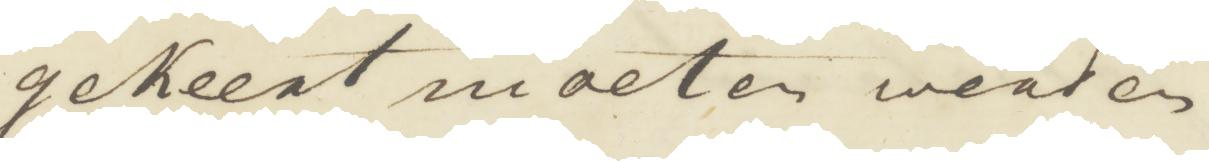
gekeert moeten werden
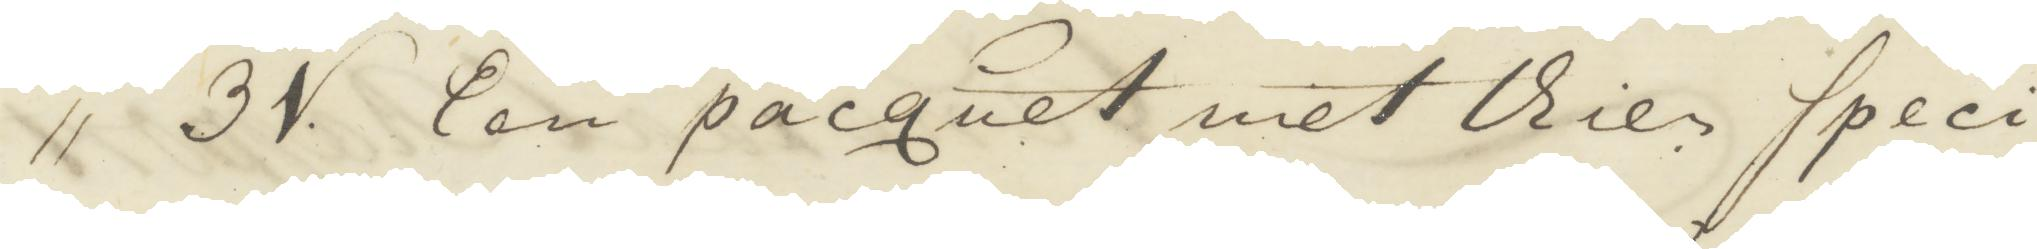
„ 31. Een pacquet met thien speci
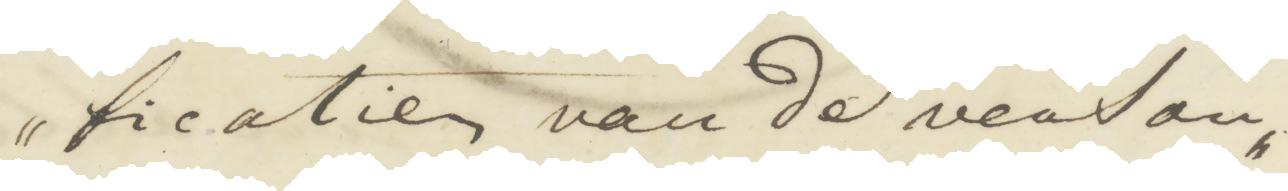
„ficatien van de verson„
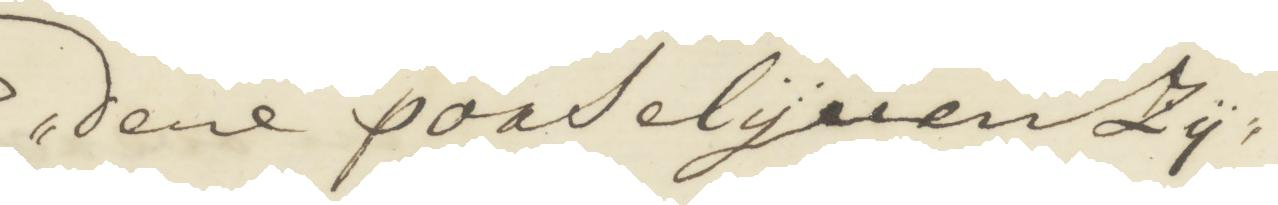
„dene porselijnen zij„
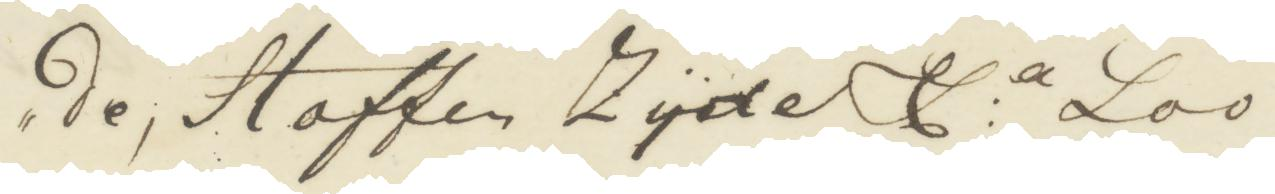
„de, stoffen zijde &:a soo
